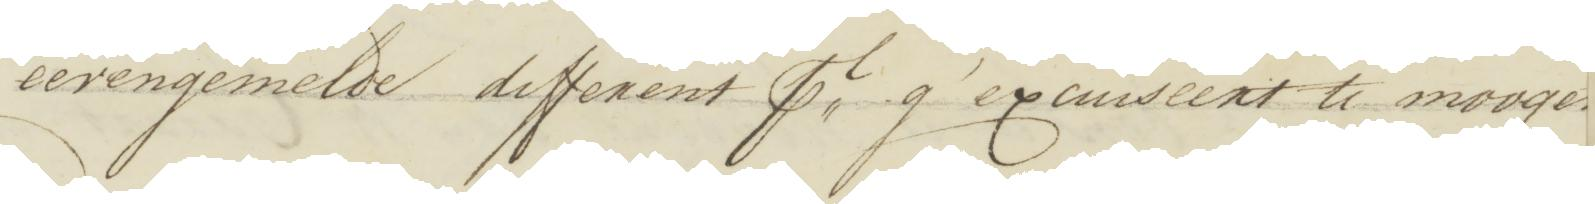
eevengemelde different p„l g’excuiseert te moogen
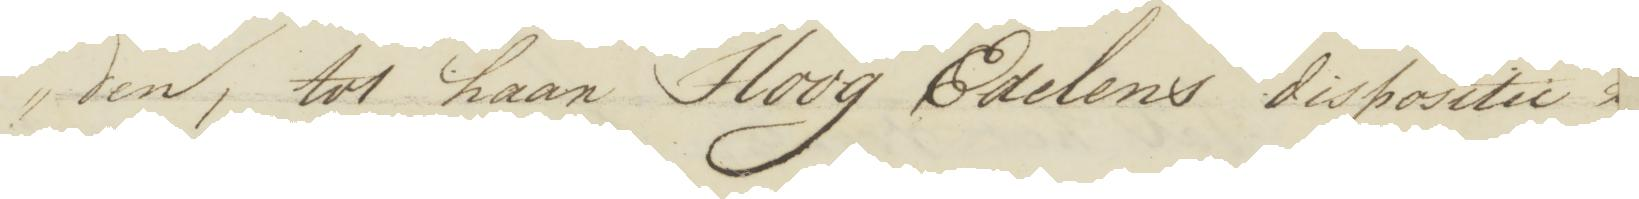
„den, tot haar Hoog Edelens dispositie
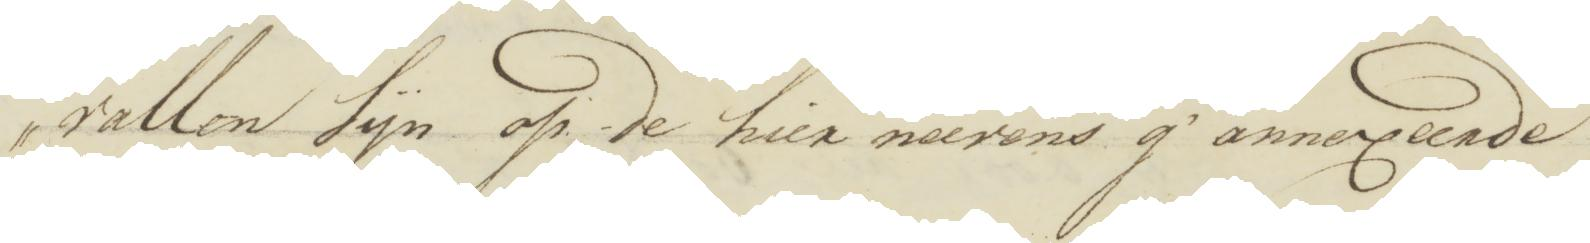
„ vallen Sijn op de hier neevens g’annexeerde
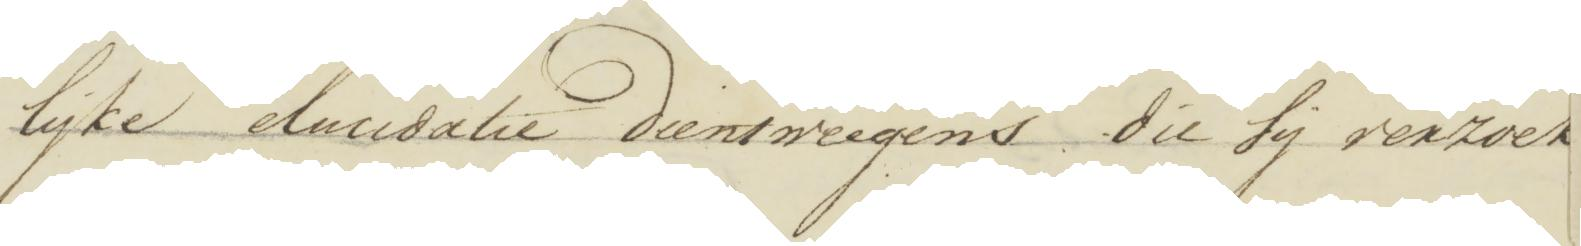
lijke lucidatie dient weegens die sij verzoek
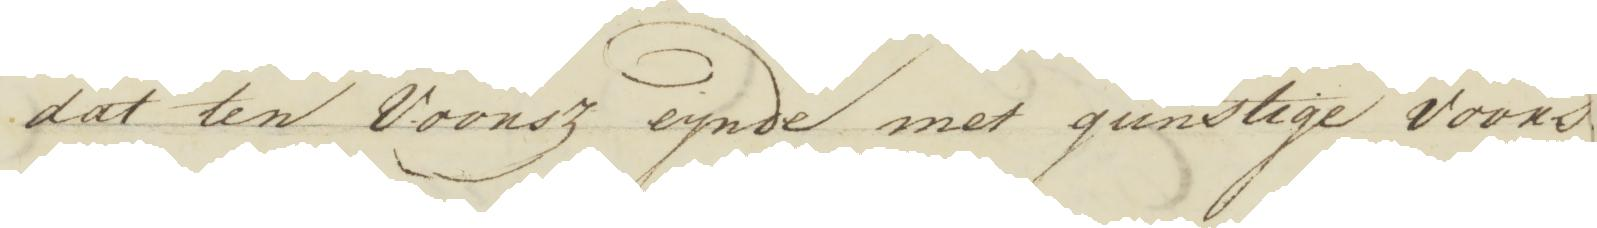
dat ten voorsz eijnde met gunstige voors
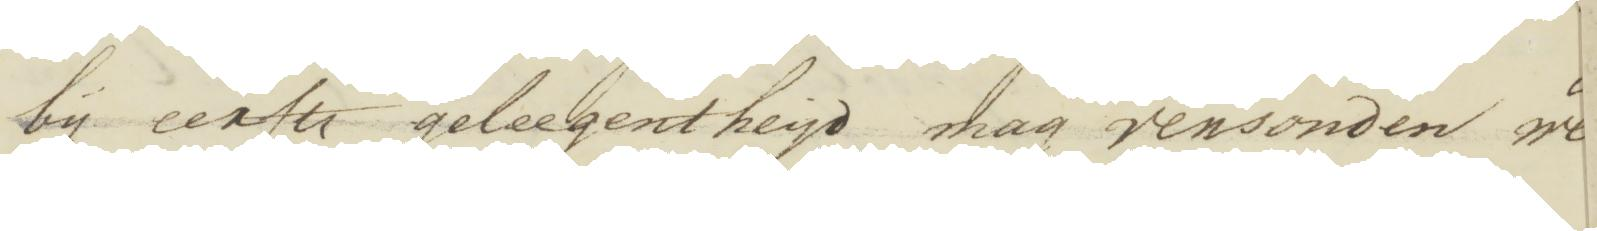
bij eerste geleegentheijd mag versonden we
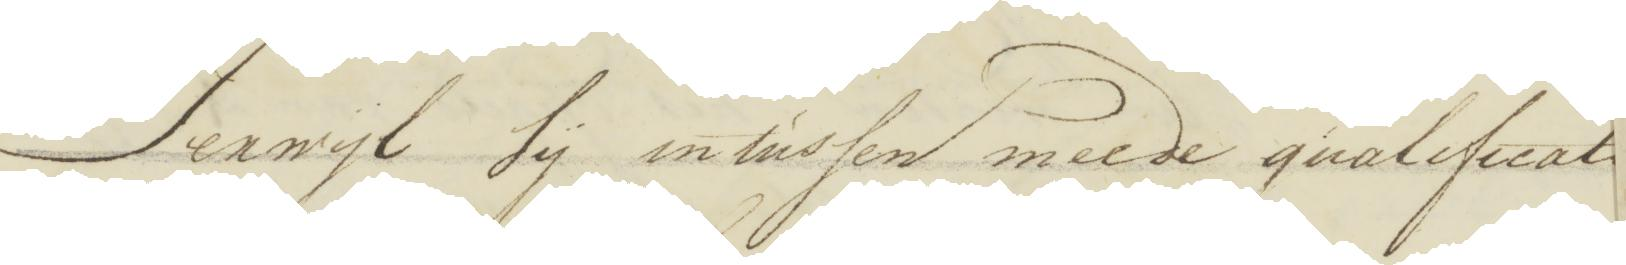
Terwijl Sij intussen meede qualificat
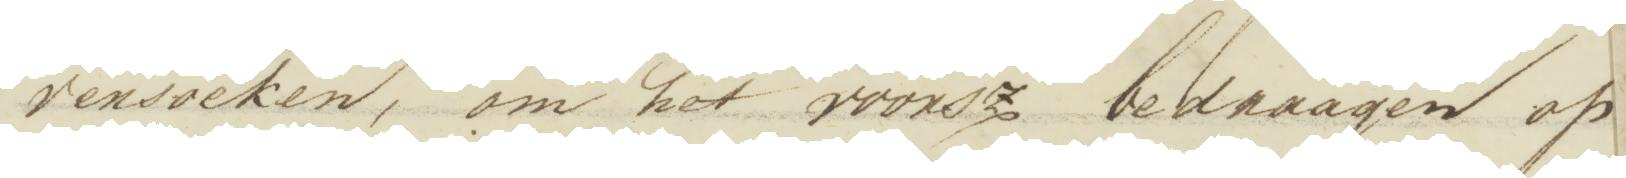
versoeken, om het voorsz bedraagen op
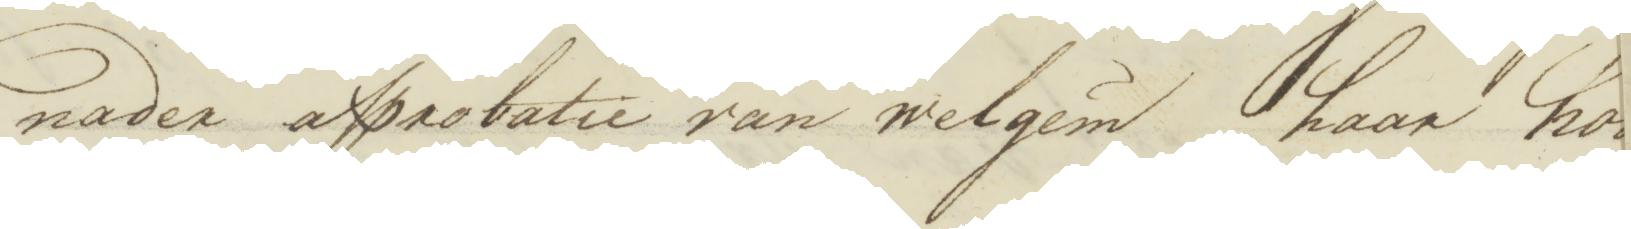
nader approbatie van welgem haar ho
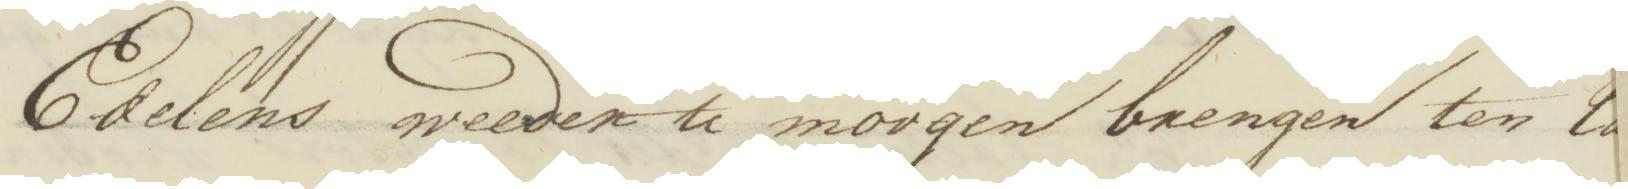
Edelens weeder te moogen brengen ten
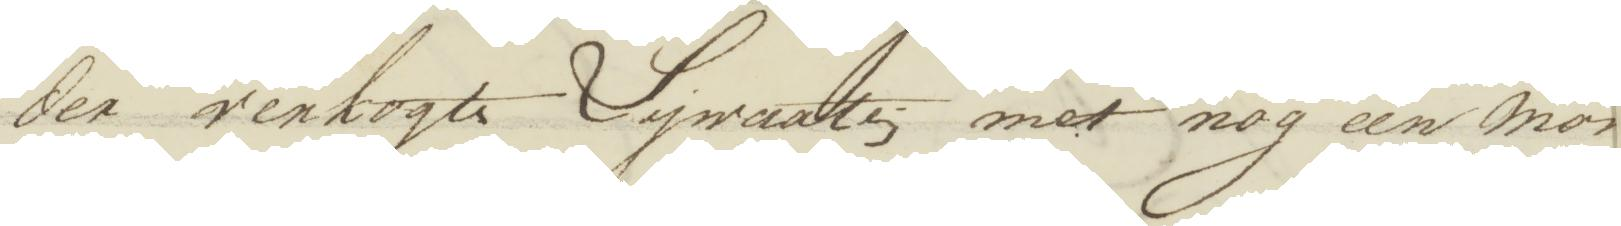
der verkogten Lijwaaten met nog een mo
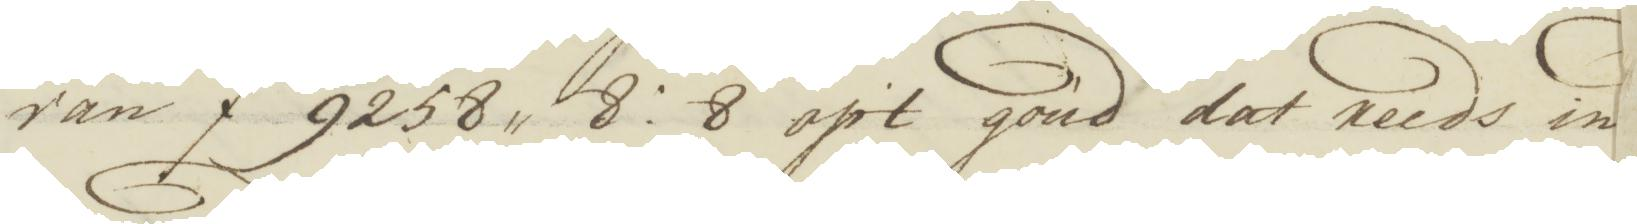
van ƒ 9258„ 8: 8 op ’t goud dat reeds in
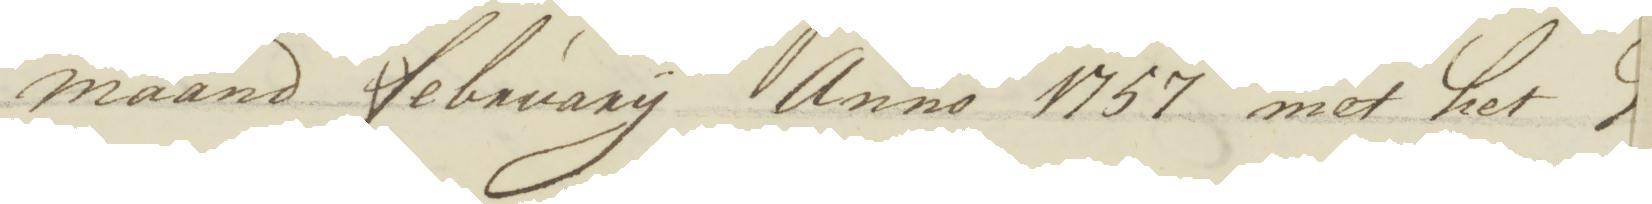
maand februarij Anno 1757 met het
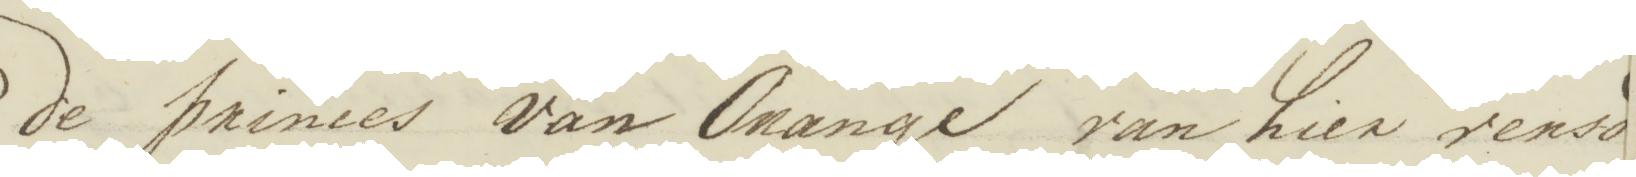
de princes van Orange van hier verso
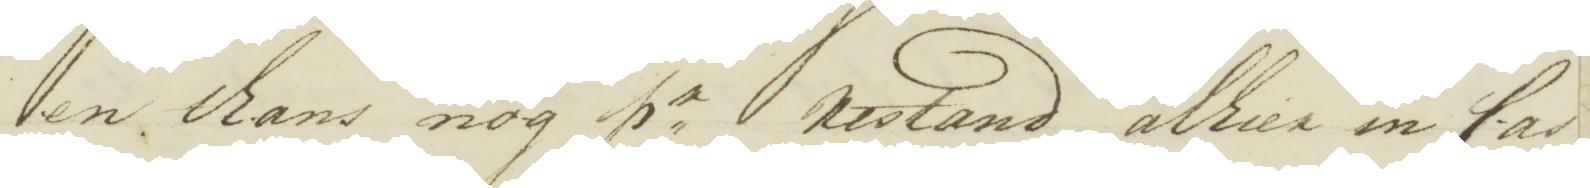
en thans nog p„r restand alhier in Cas
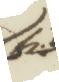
br.
